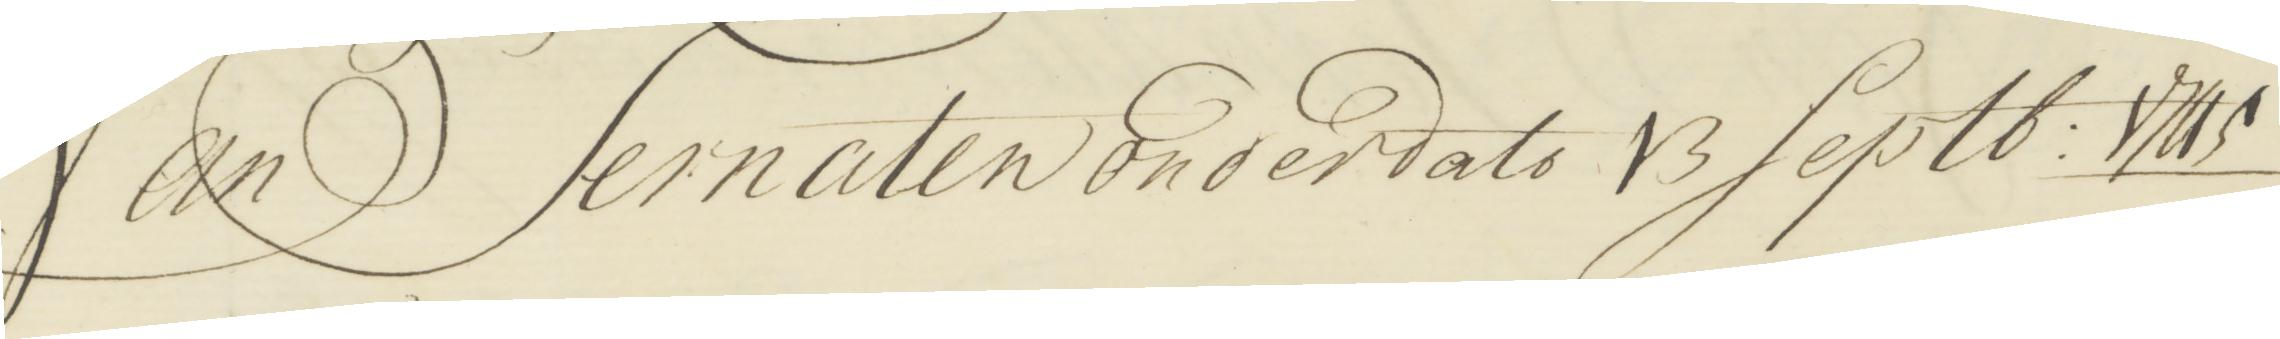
Van Ternaten onder dato 13 Septb: 1745
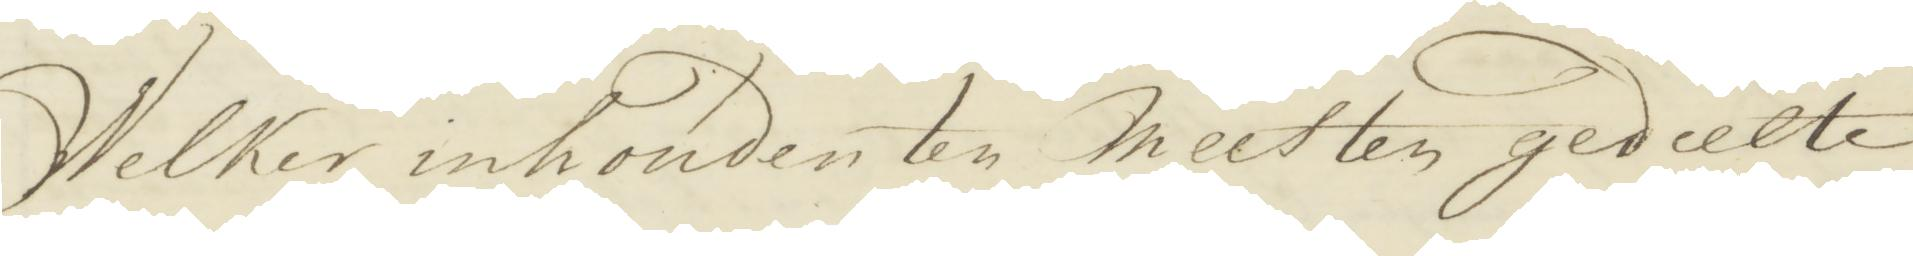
Welker inhouden ten meesten gedeelte
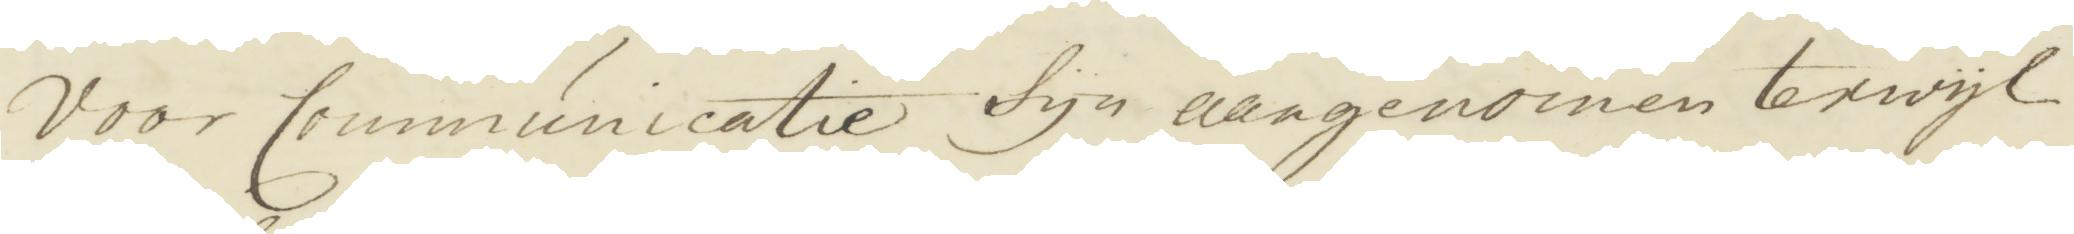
voor Communicatie sijn aangenomen terwijl
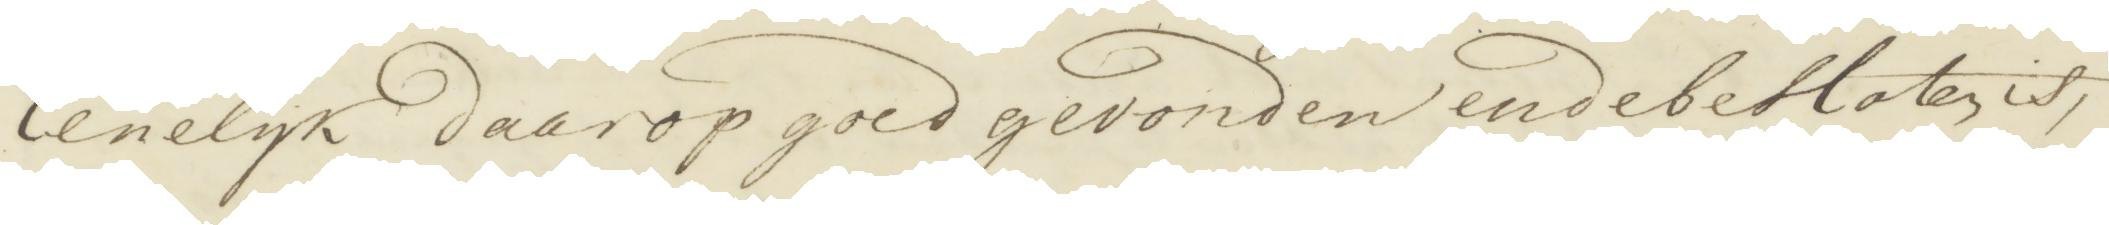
Eenelijk daarop goed gevonden ende besloten is,
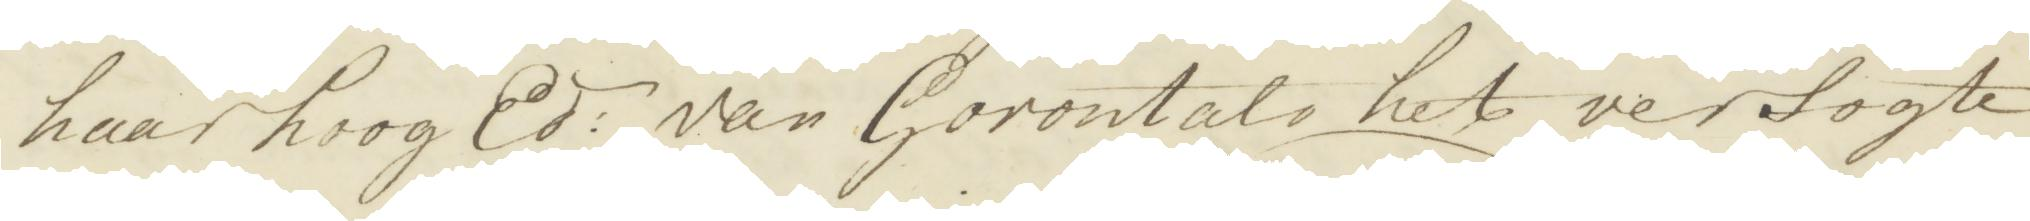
haar hoog Ed: van Gorontalo het versogte
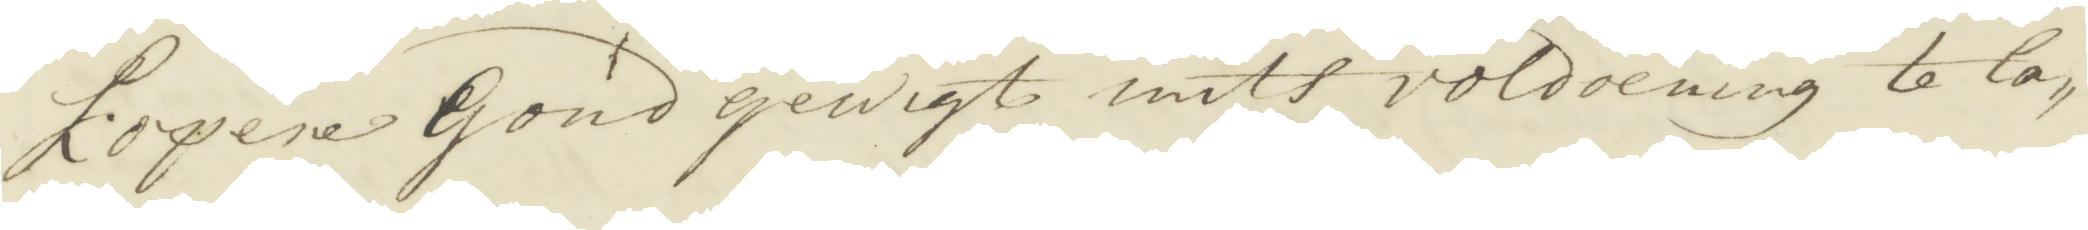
kopere Goud gewigt mits voldoening te la„
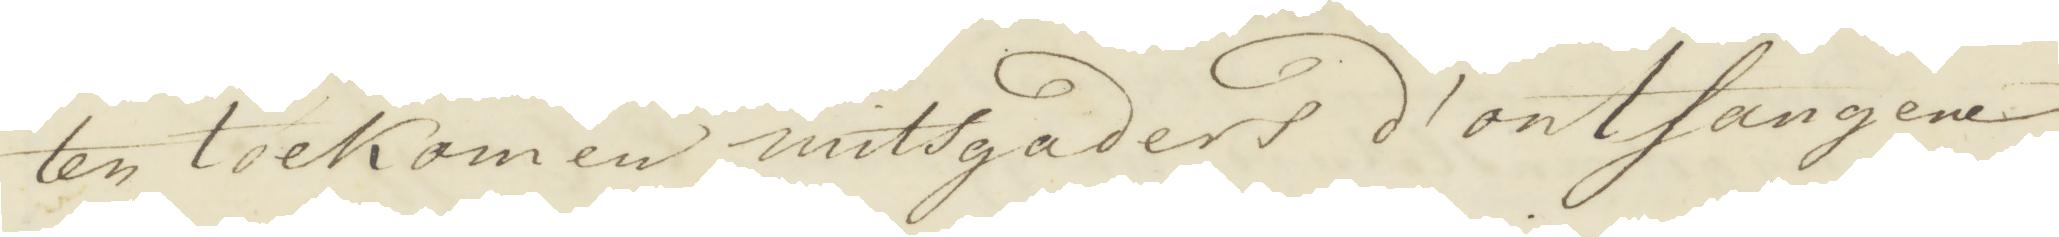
ten toekomen mitsgaders d’ ontfangene
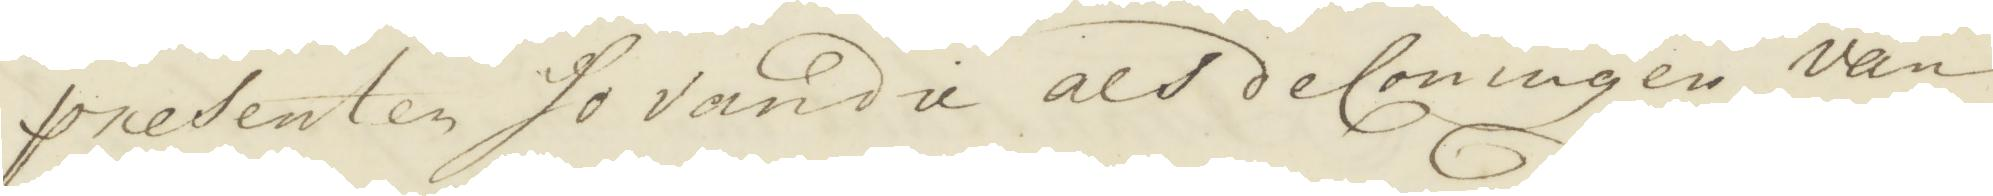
presenten so van die als de Coningen van
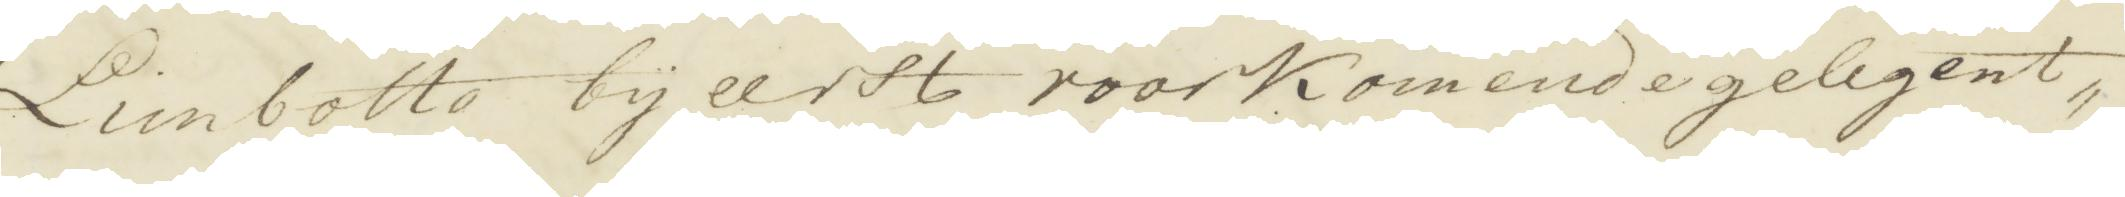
Limbotto bij eerst voorkomende gelegent„
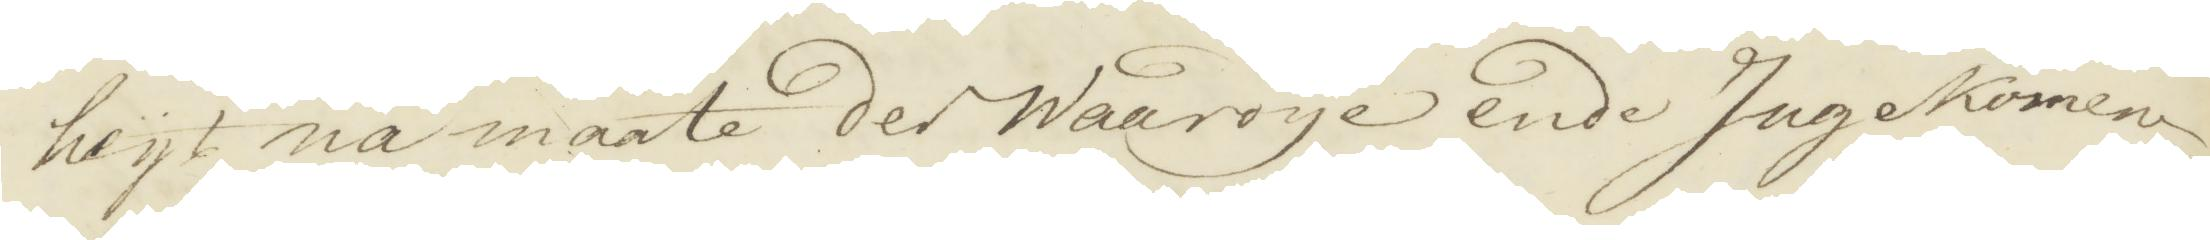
heijt na maate der waardije ende Jngekomene
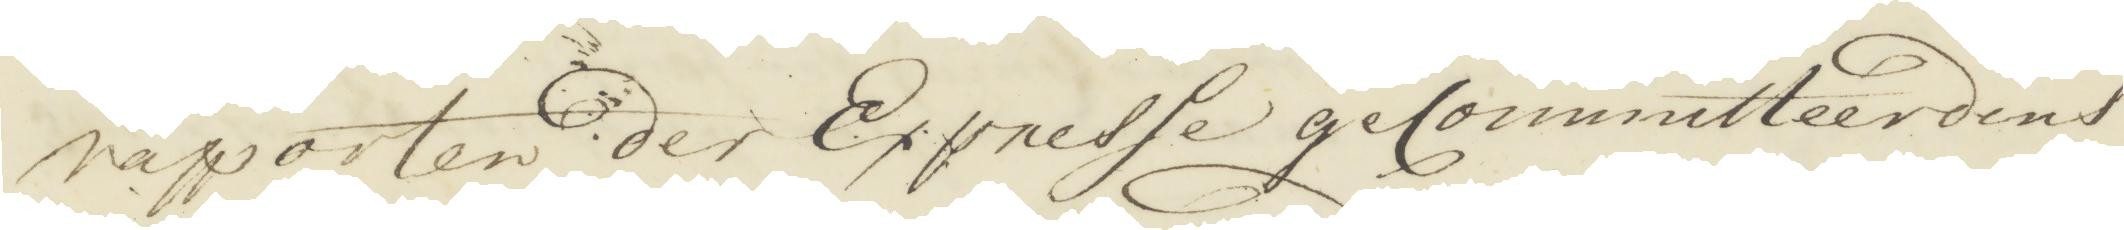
rapporten der Expresse gecommitteerdens
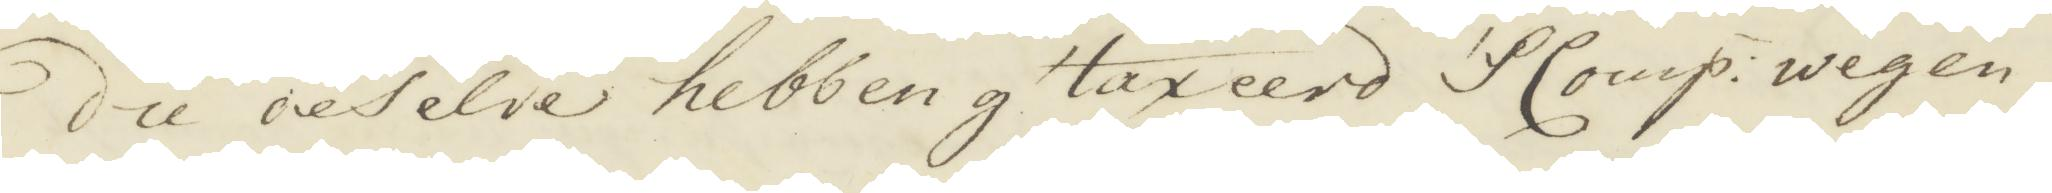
die deselve hebben g’taxeerd ’S Comp: wegen
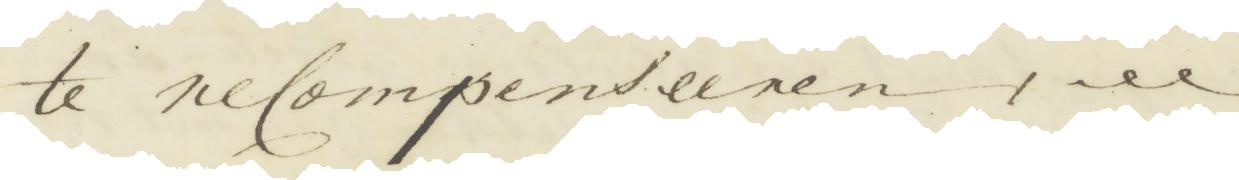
te recompenseeren,
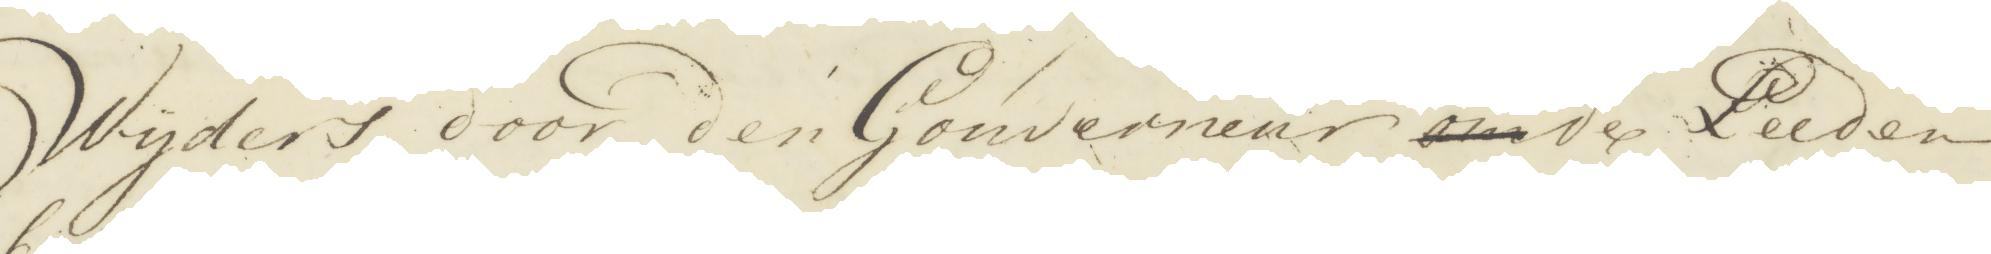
Wijders door den Gouverneur om de Leeden
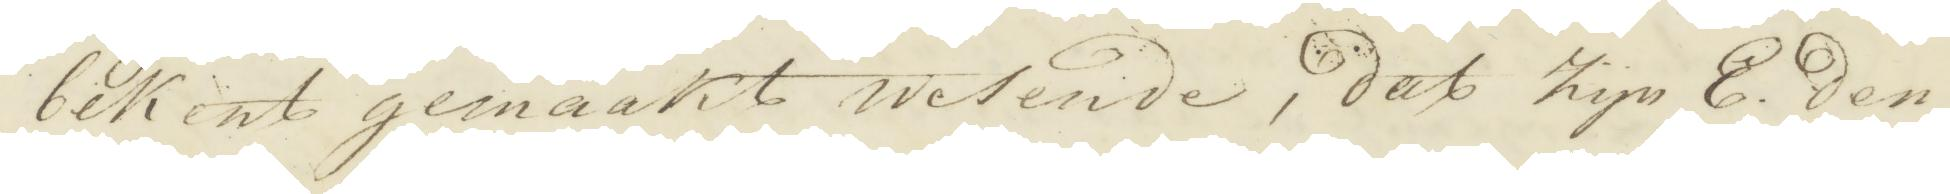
bekent gemaakt wesende, dat zijn E. den
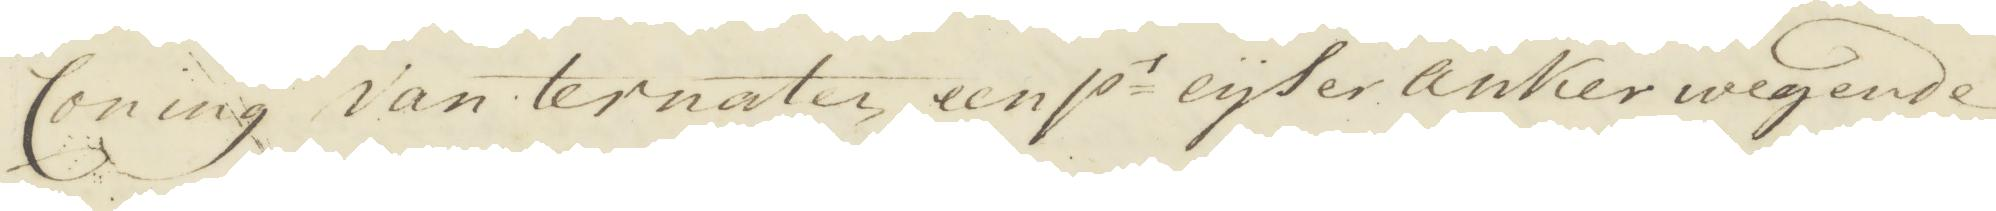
Coning van ternaten een p=s eijser anker wegende
